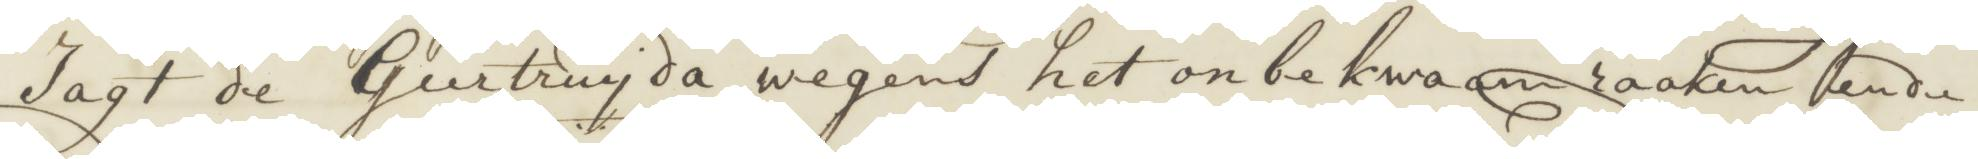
Jagt de Geertruijda wegens het onbekwaam raaken en de
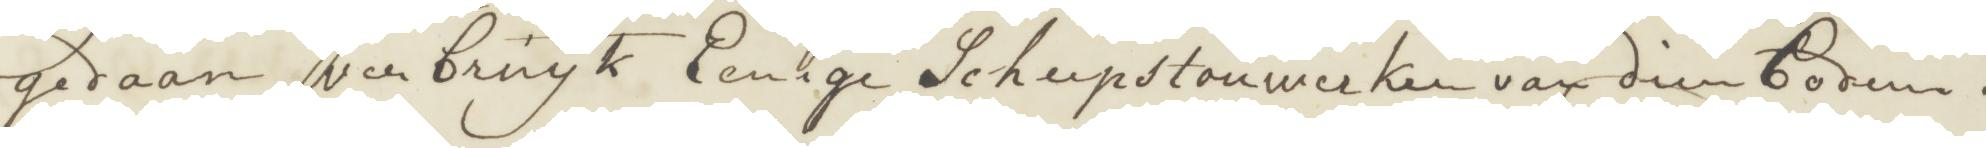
gedaan ver bruijk Eenige scheepstouwerken van dien bodem
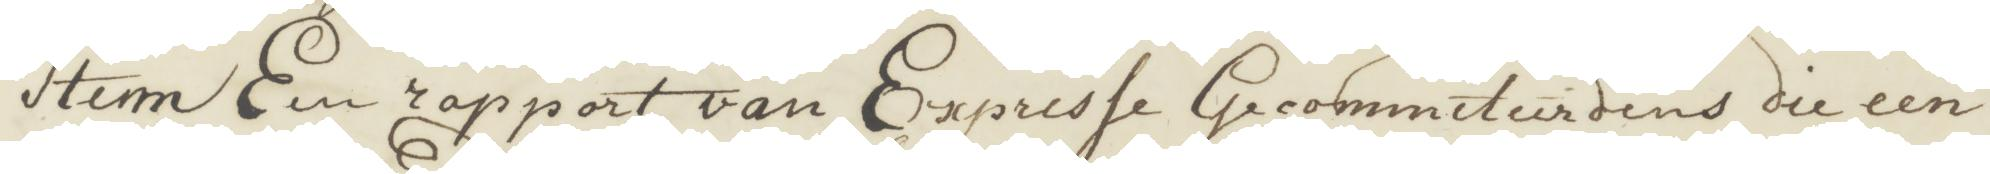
Item Een rapport van Expresse Gecommiteerdens die een
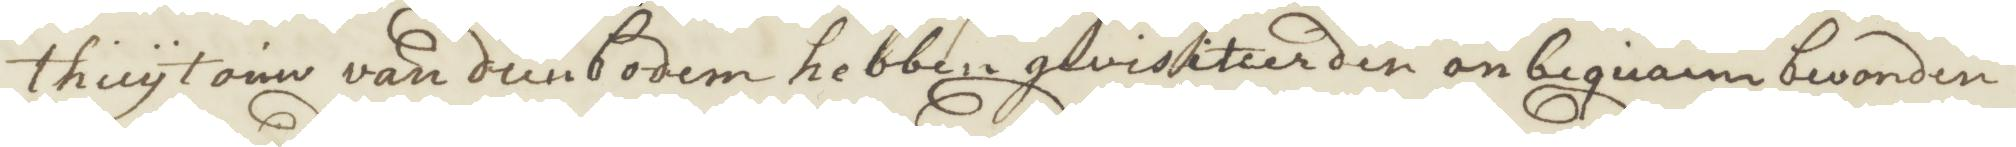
thuijtouw van dien bodem hebben gevisiteerd en onbequaem bevonden
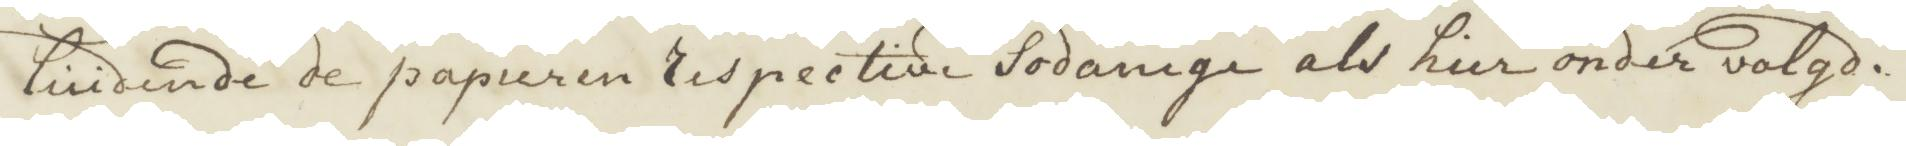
luidende de papieren respective sodanige als hier onder volgd.
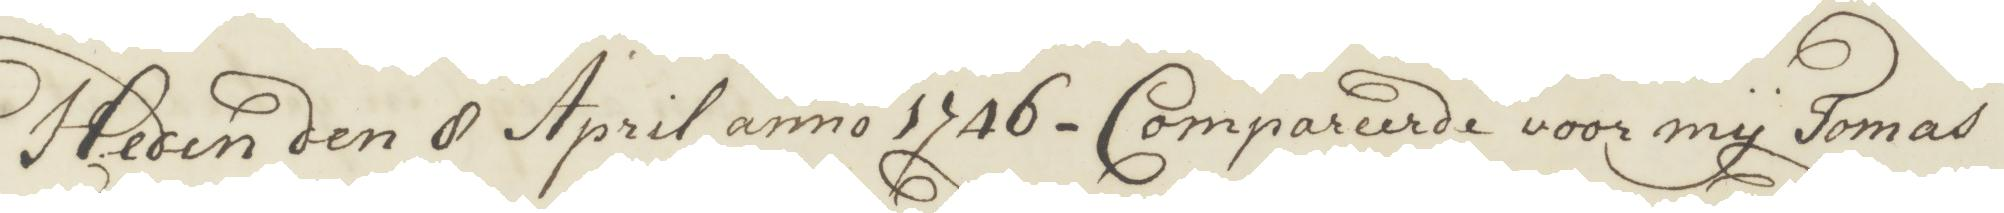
Heden den 8 April anno 1746 - Compareerde voor mij Tomas
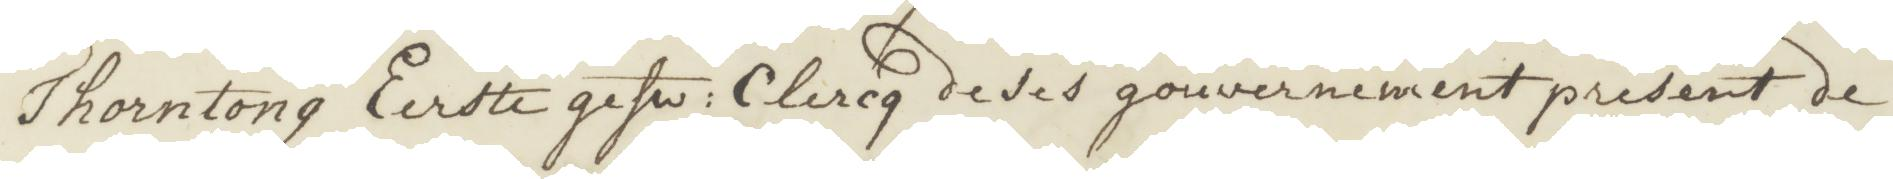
Thorntong Eerste gesw: Clercq deses gouvernement present de
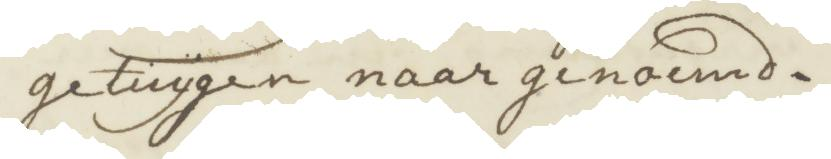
getuijgen naar genoemd -
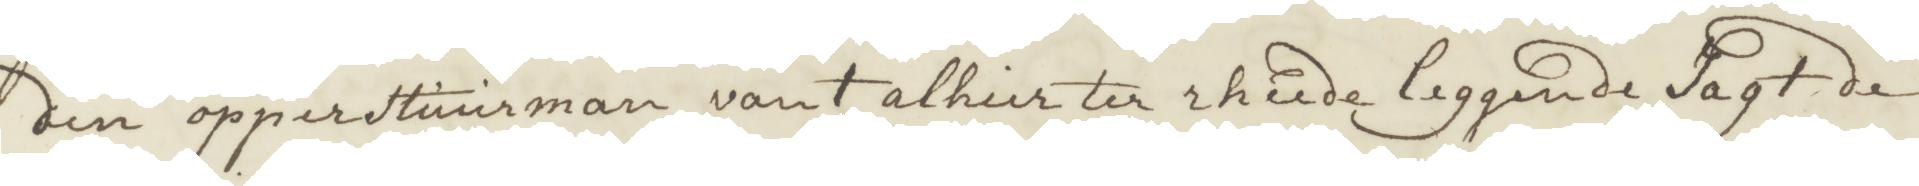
den opperstuurman van t alhier ter rheede leggende Iagt, de
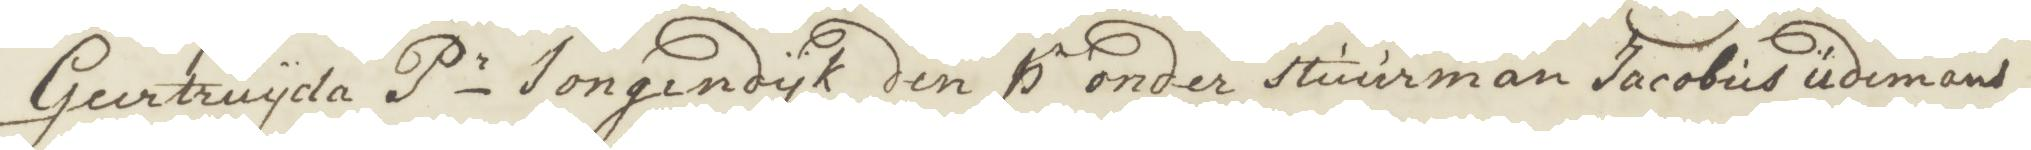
Geertruijda P–r Iongendijk den pr onder stuurman Iacobus udemans
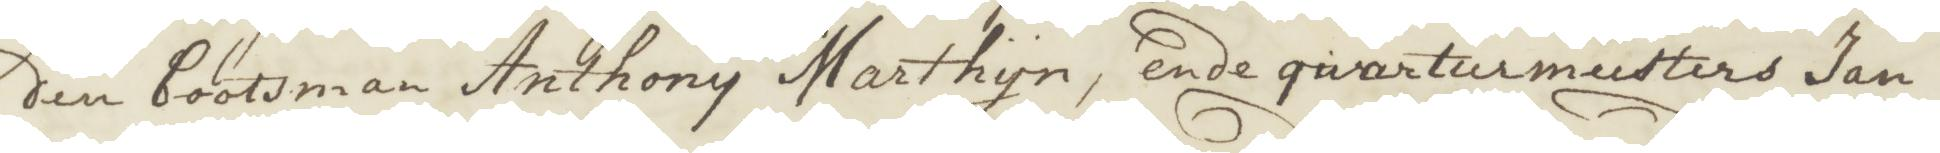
den bootsman Anthonij Marthijn, ende quartiermeesters Ian
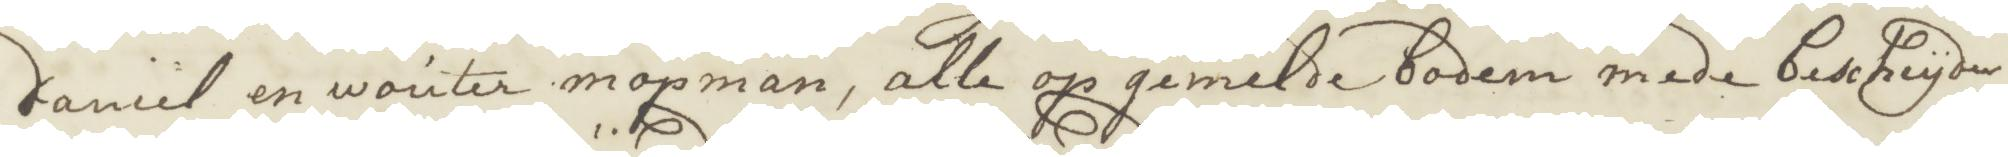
daniël en wouter mopman, alle op gemelde bodem mede bescheijden
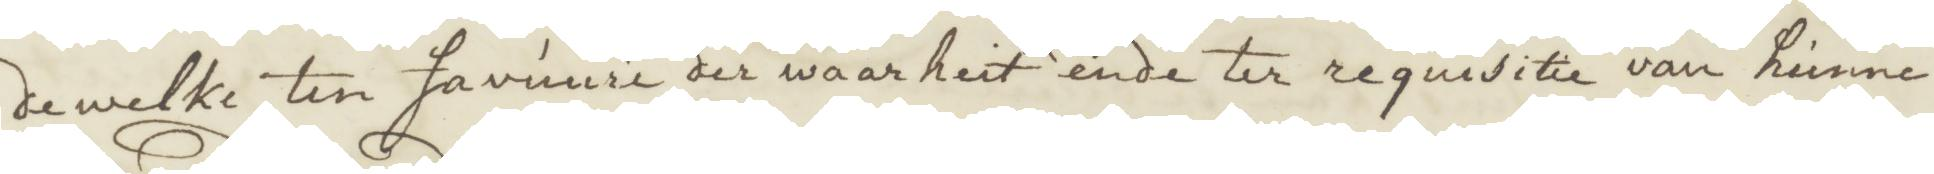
de welke ten favuure der waarheit ende ter requisitie van hunne
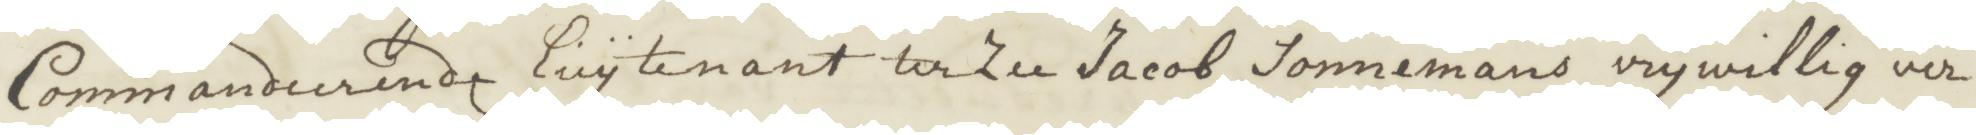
Commandeerende luijtenant ter zee Iacob Sonnemans vrijwillig ver
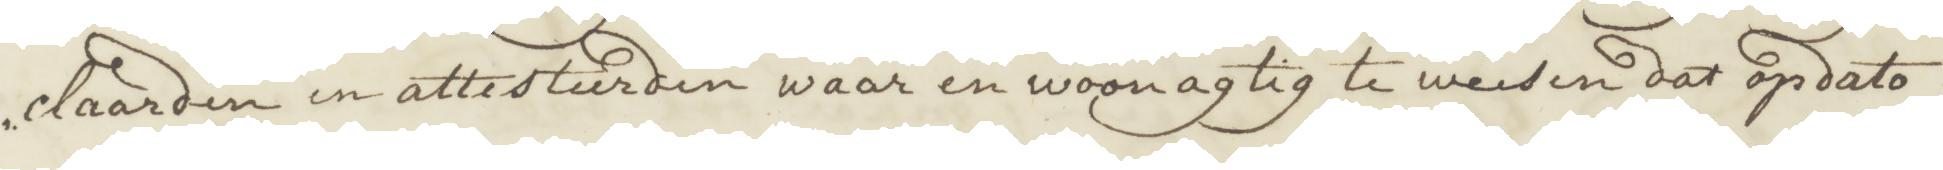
„claarden en attesteerden waar en woonagtig te weesen dat op dato
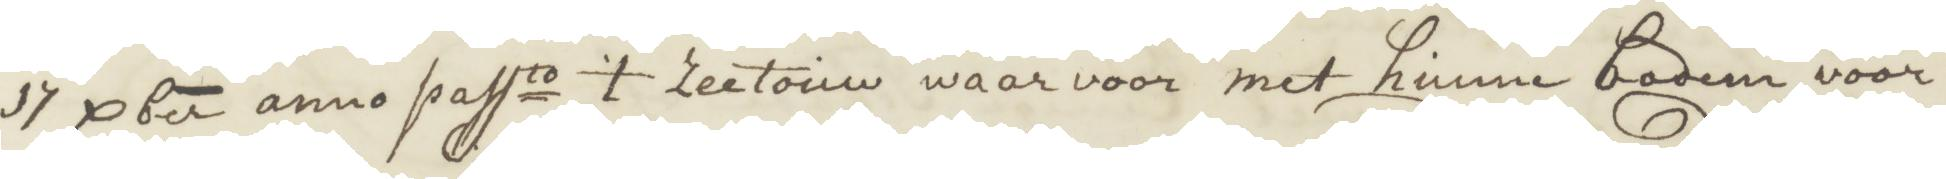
17 xber anno pass=os ’t zeetouw waar voor met hunne bodem voor
